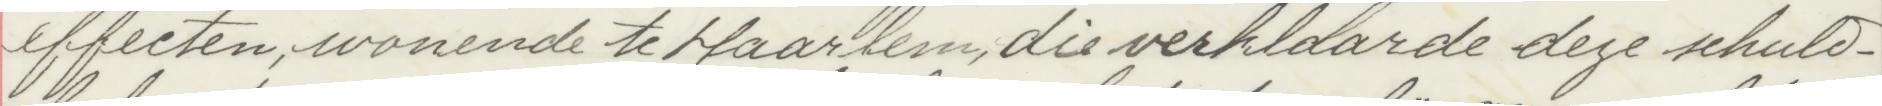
Effecten, wonende te Haarlem, die verklaarde deze schuld-
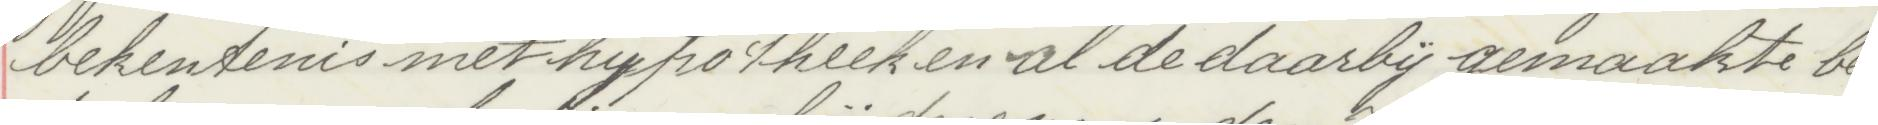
bekentenis met hypotheek en al de daarbij gemaakte be
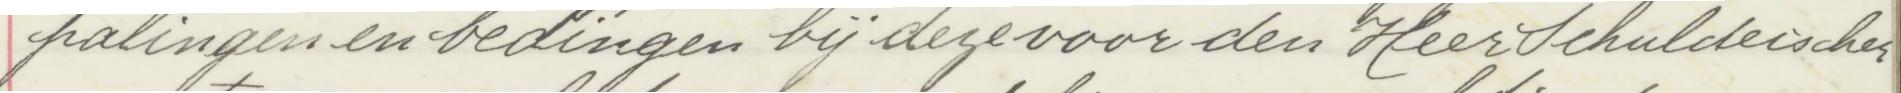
palingen en bedingen bij deze voor den Heer Schuldeischer
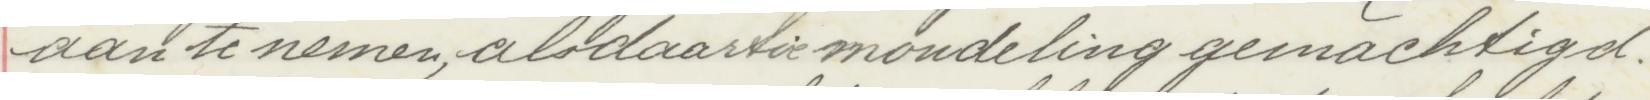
aan te nemen, als daartoe mondeling gemachtigd
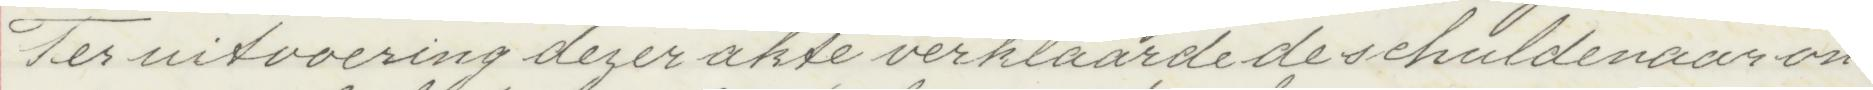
Ter uitvoering dezer akte verklaarde de schuldenaar on
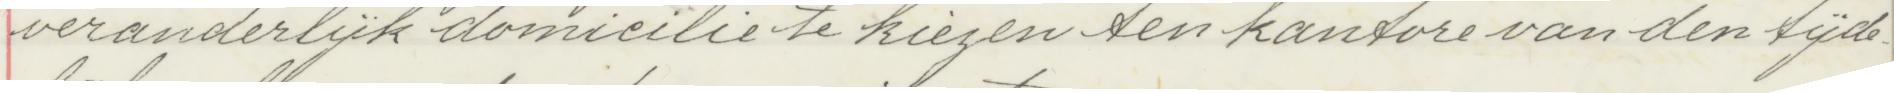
veranderlijk domicilie te kiezen ten kantore van den tijde
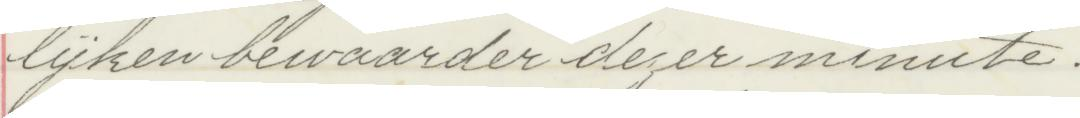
lijken bewaarder dezer minute.
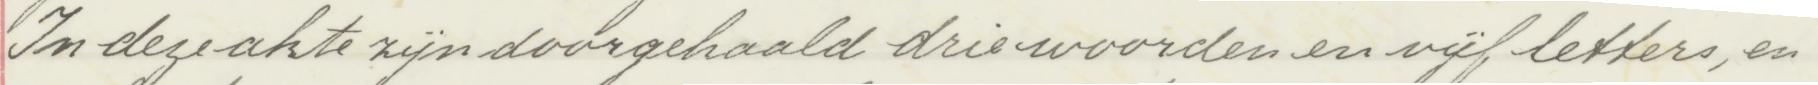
In deze akte zijn doorgehaald drie woorden en vijf letters, en
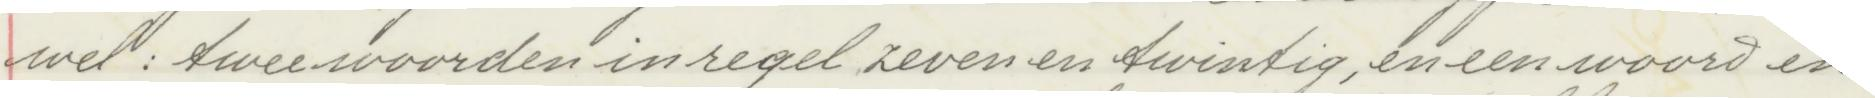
wel: twee woorden in regel zeven en twintig, en een woord en
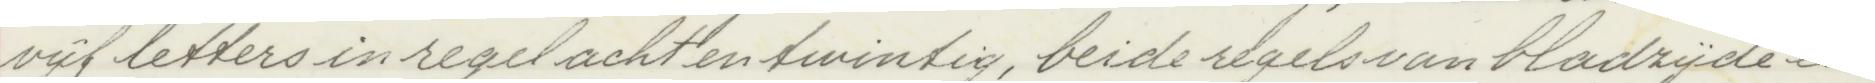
vijf letters in regel acht en twintig, beide regels van bladzijde een.
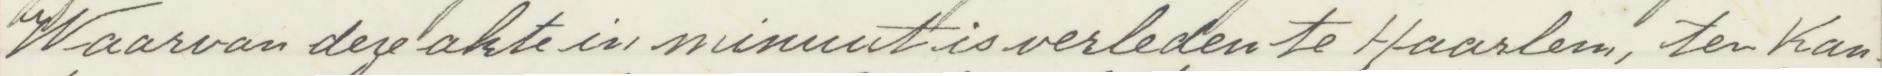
Waarvan deze akte in minuut is verleden te Haarlem, ten Kan
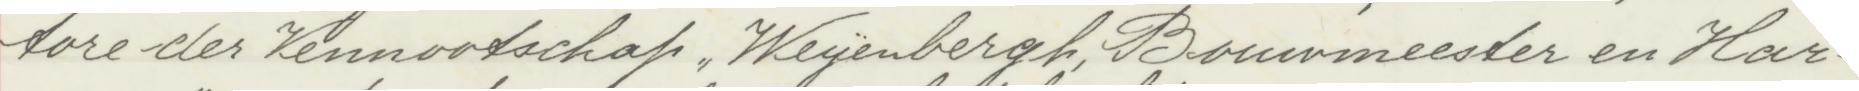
tore der Vennootschap „Weijenbergh, Bouwmeester en Har-
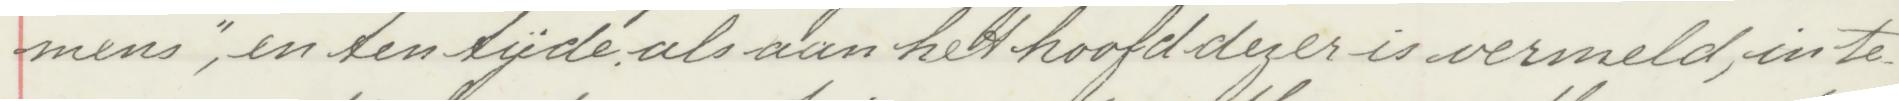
mens", en ten tijde als aan het hoofd dezer is vermeld, in te-
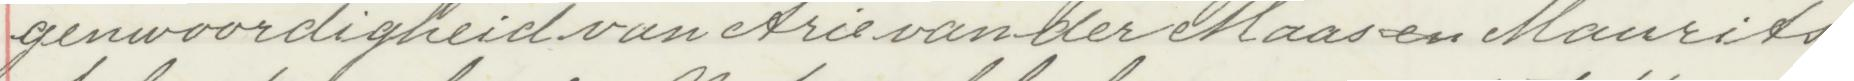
genwoordigheid van Arie van der Maas en Maurits
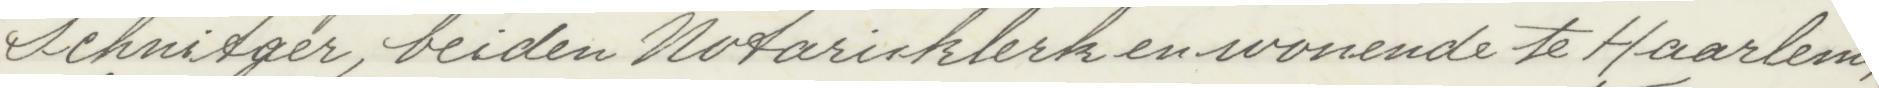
Schnitger, beiden Notarisklerk en wonende te Haarlem,
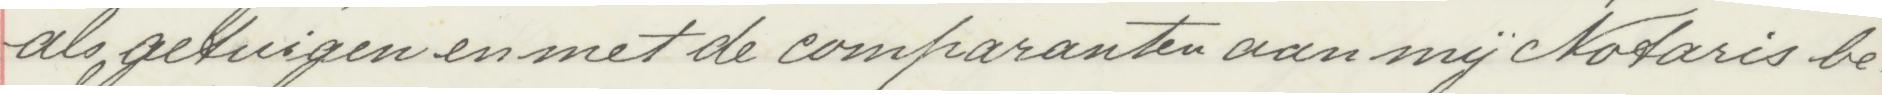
als getuigen en met de comparanten aan mij Notaris be
